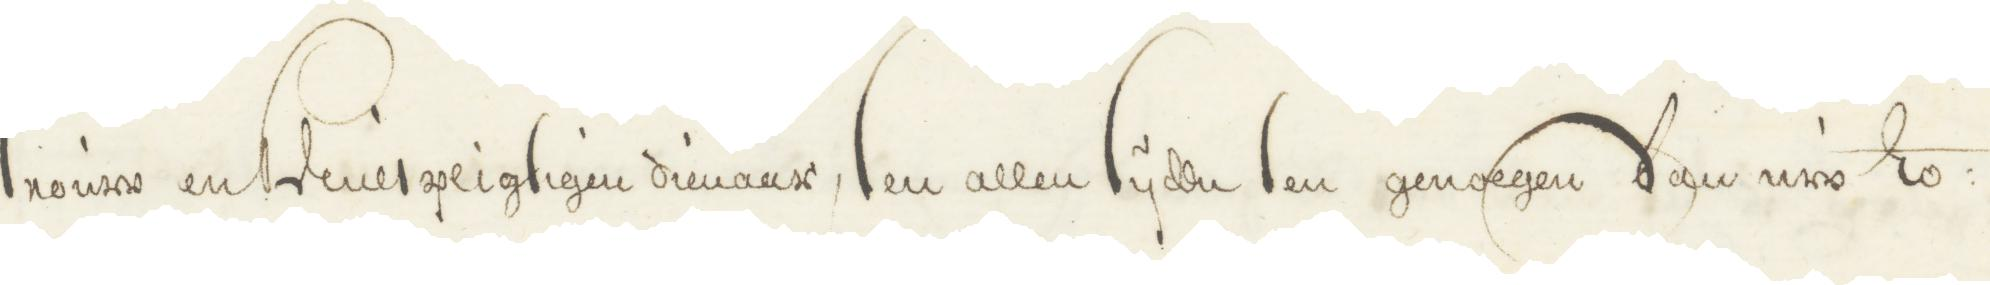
trouw en schultpligtigen dienaar, ten allen tijden ten genoegen van uw ho:
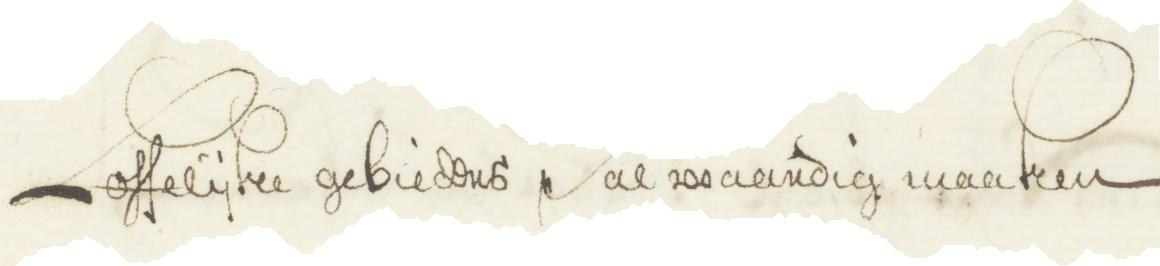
Loffelijke gebieders sal waardig maaken
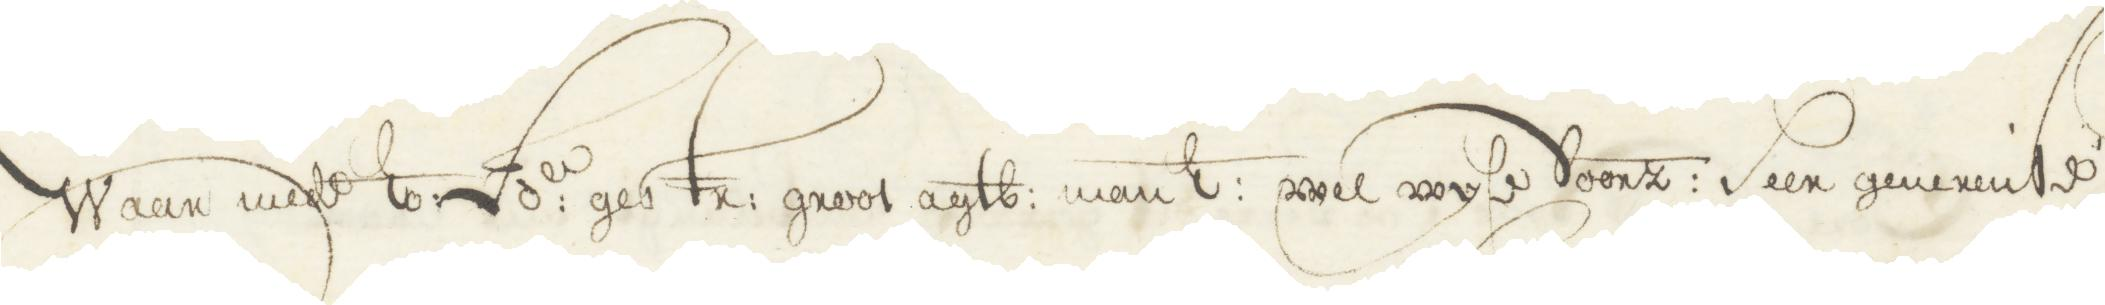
Waar mede ho: Ed:le gestr: groot agtb: manh: wel wijse voorz: seer genereuse
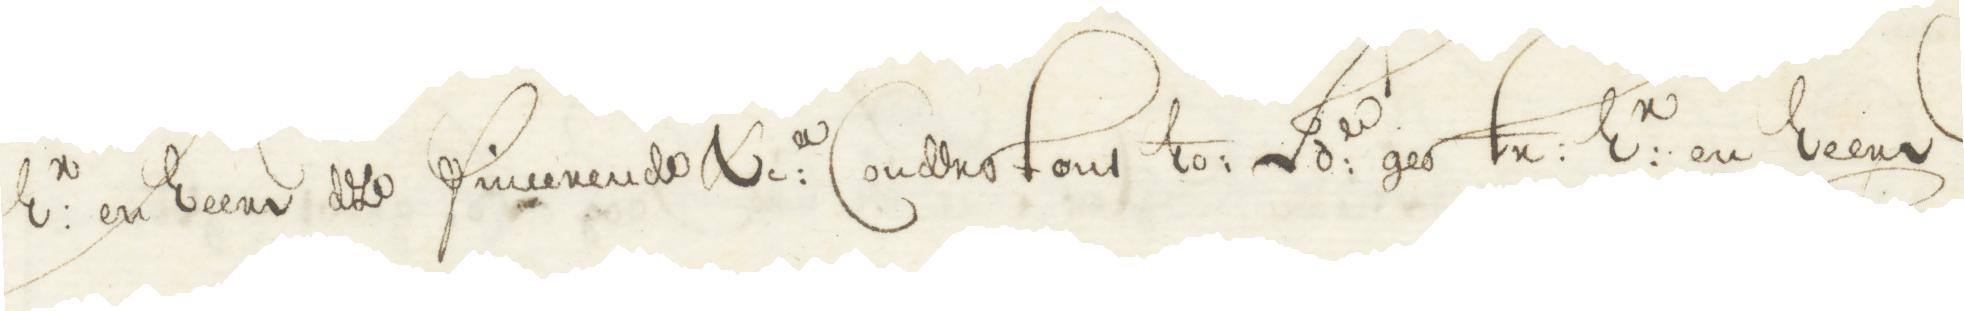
h:r en heere, deze sineerende &c:a (onderstont ho: Ed:le gestr: h:r en heere
